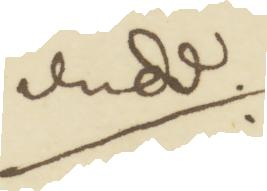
ende.
